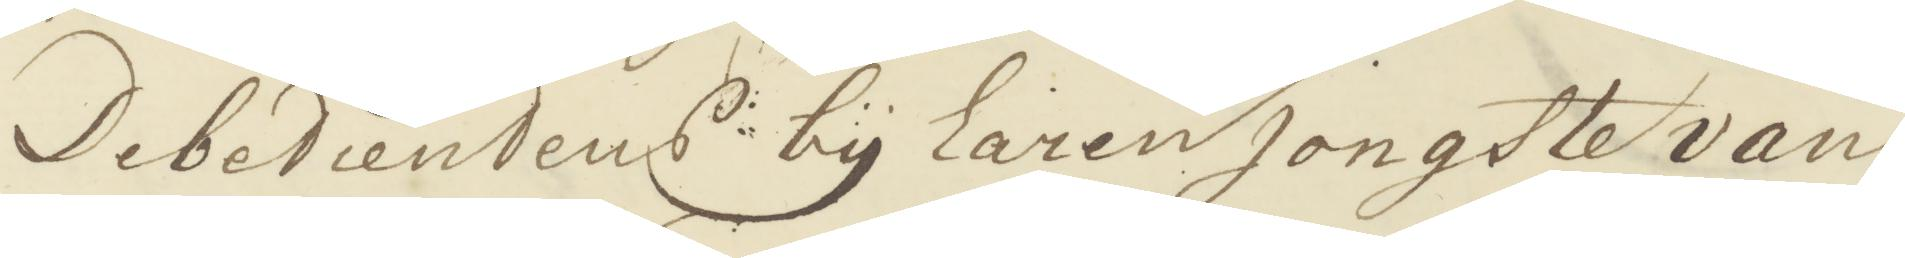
De bediendens: bij haren jongste van
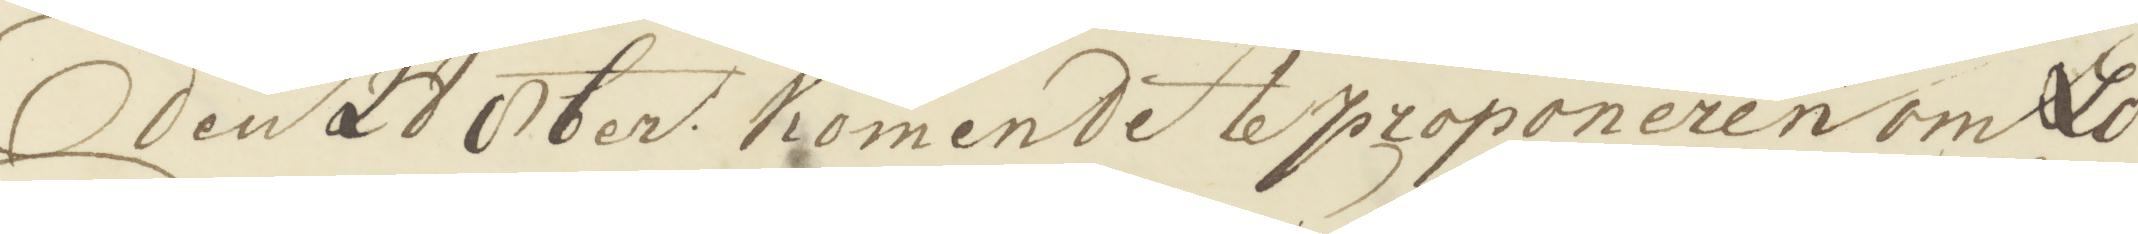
den 28 8ber: Komende te proponeren om Zo
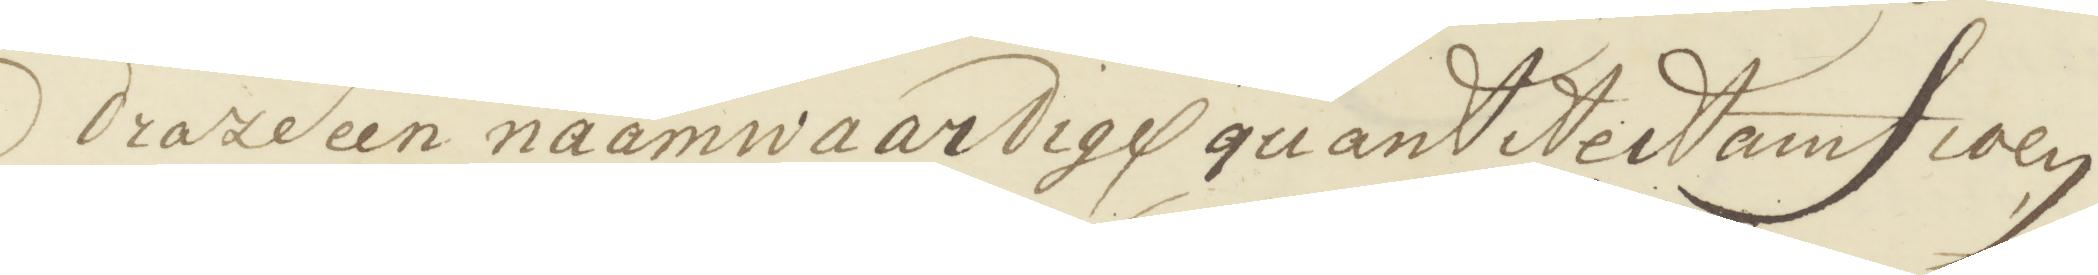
dra ze een naamwaardige quantiteit amfioen
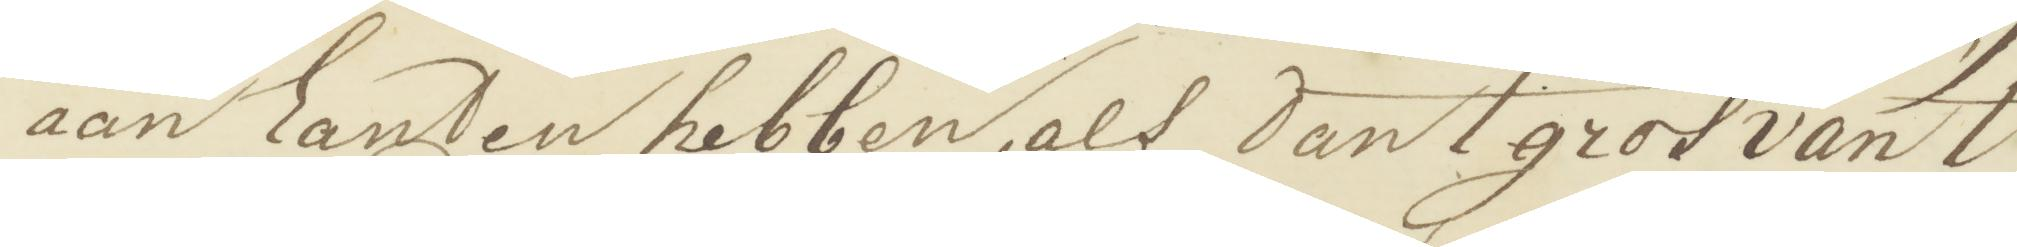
aan handen hebben, als dan ’t gros van ’t
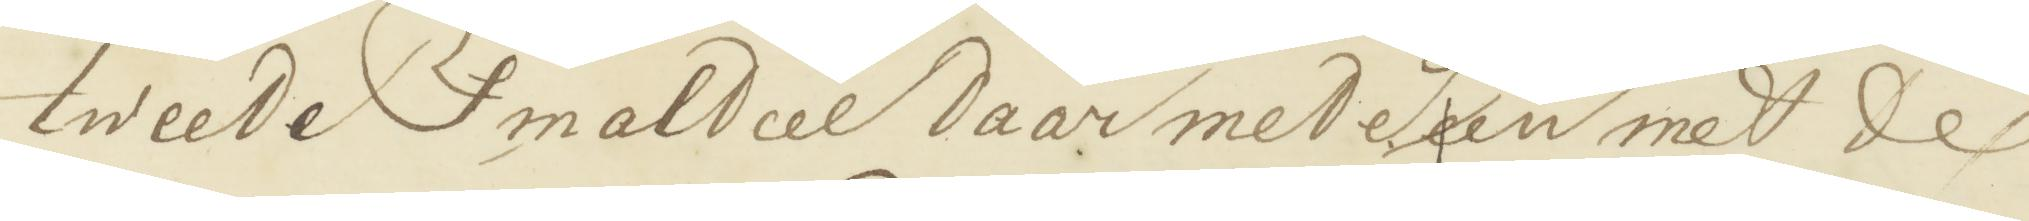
tweede Smaldeel daar mede een met de
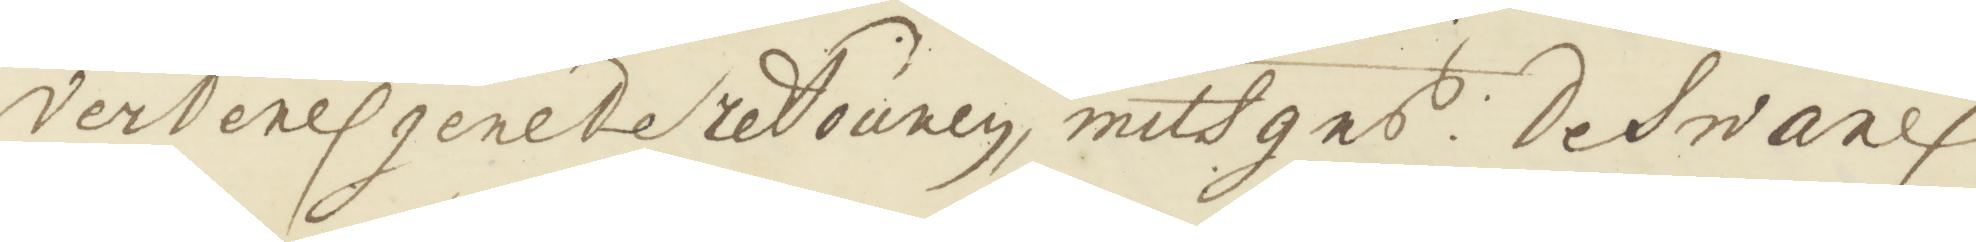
verdere gerede retouren, mitsgrs: de sware
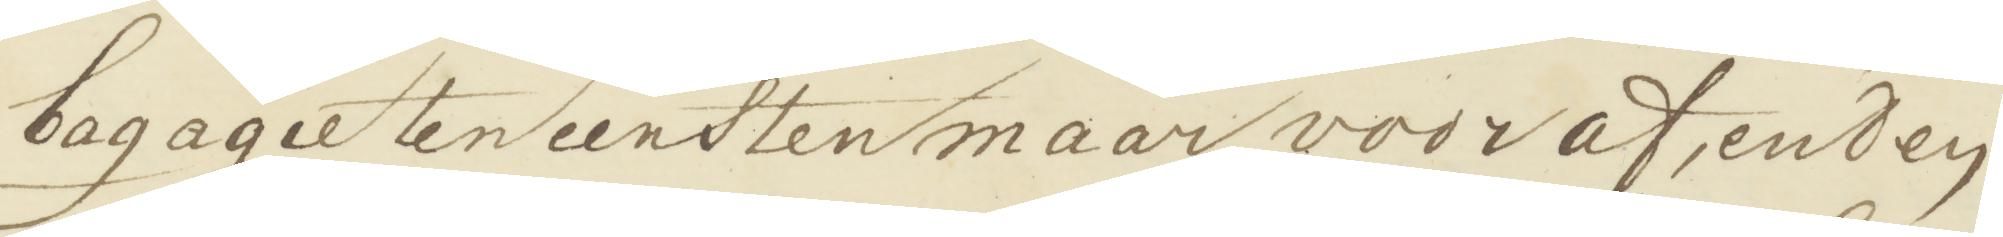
bagagie ten eersten maar vooraf, en den
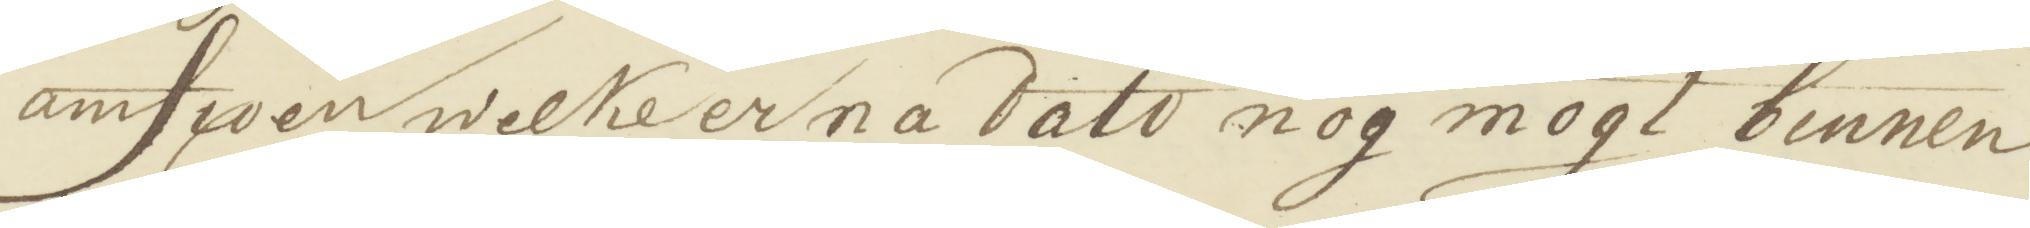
amfioen welke er na dato nog mogt binnen
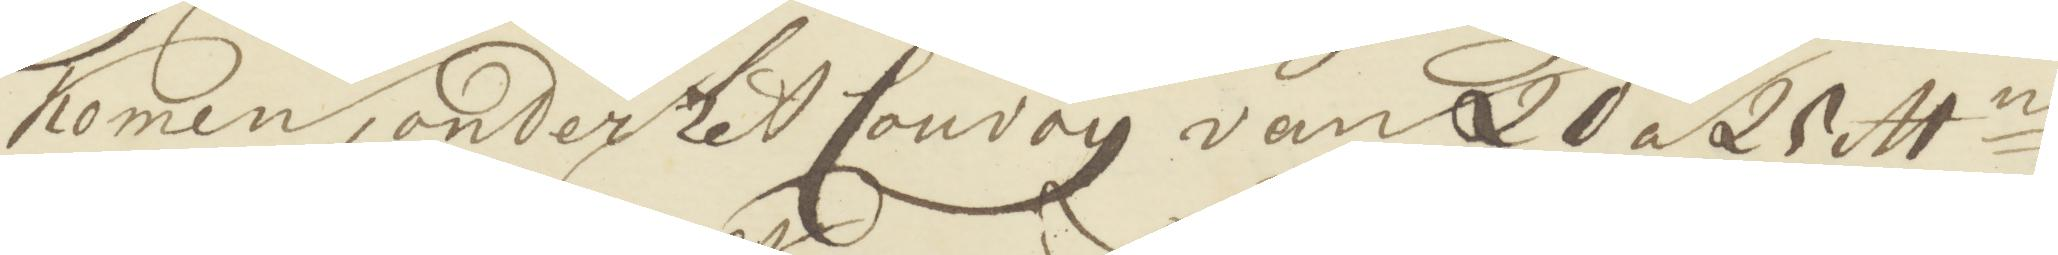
komen, onder het Convoij van 20 a 25 tt=n
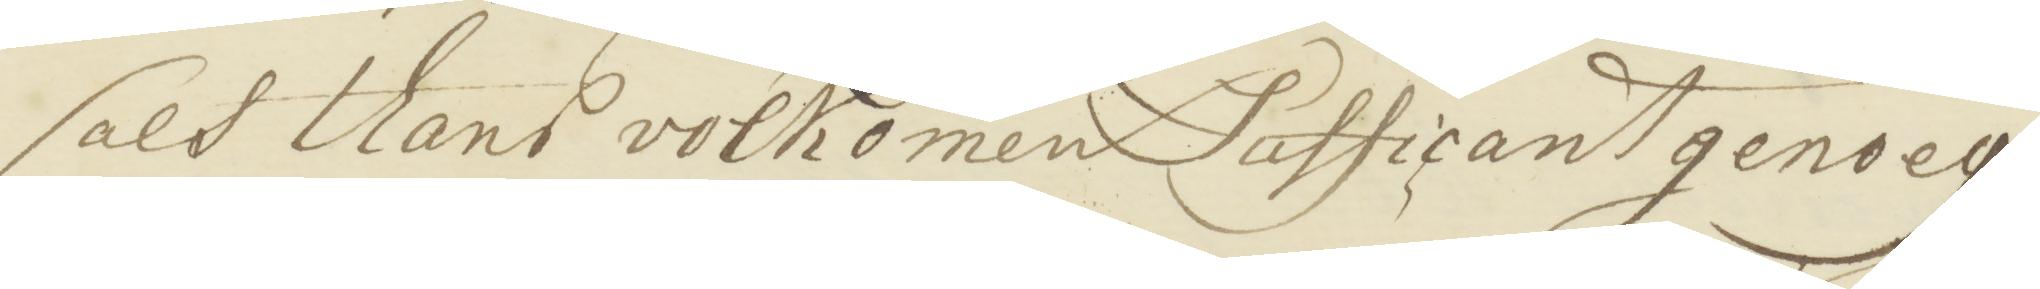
als thans volkomen Suffiçant genoeg
